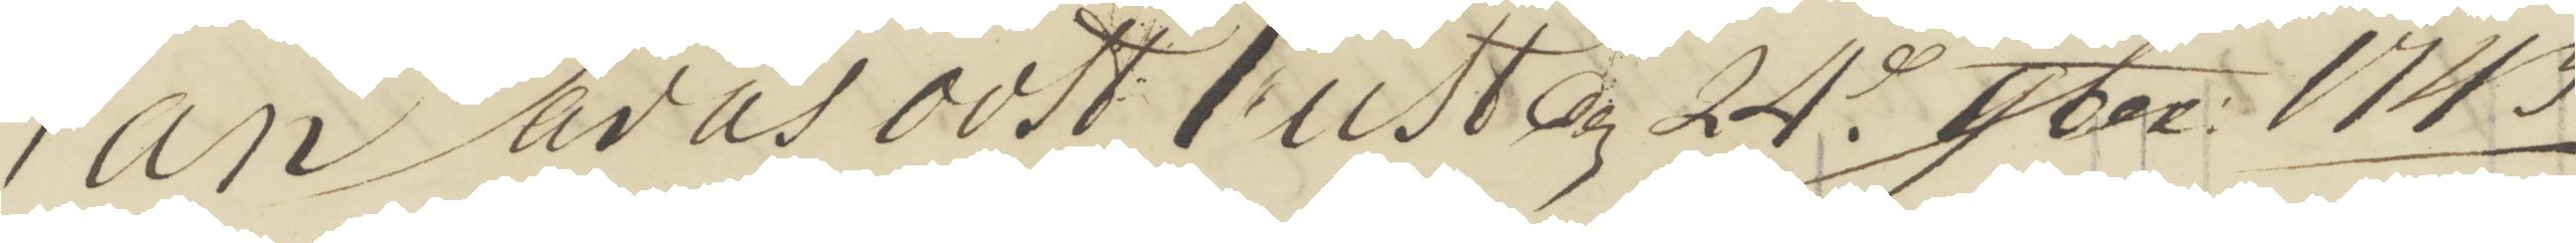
Van Javas oost Cust den 24:e 9ber: 1743
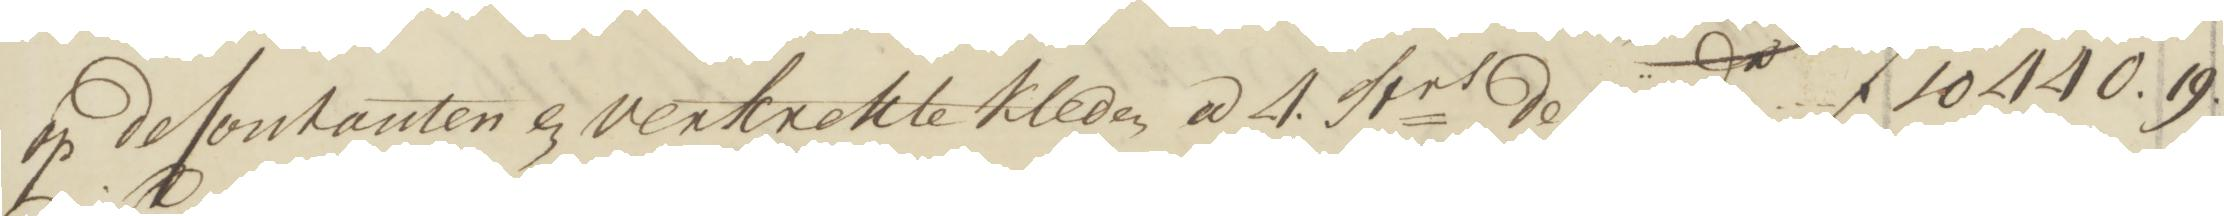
op de contanten en verstrekte kleden a 4. st=rs do rijxd:r . . . . ƒ10440. 19
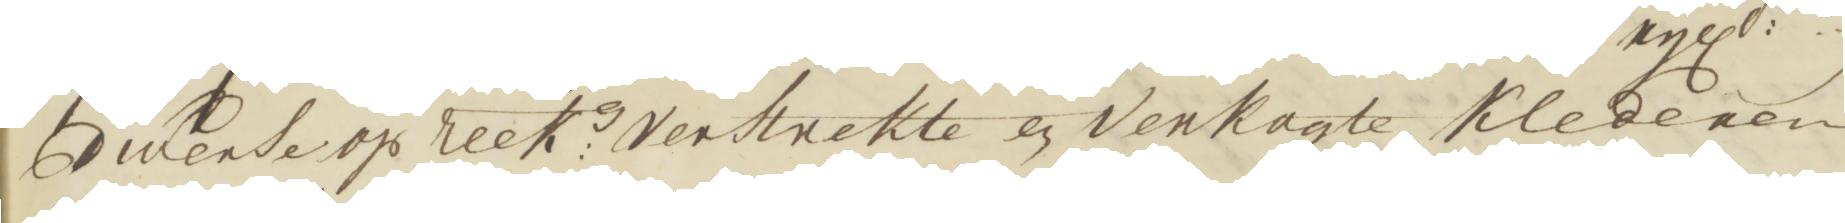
diverse op reek:en verstrekte en verkogte klederen
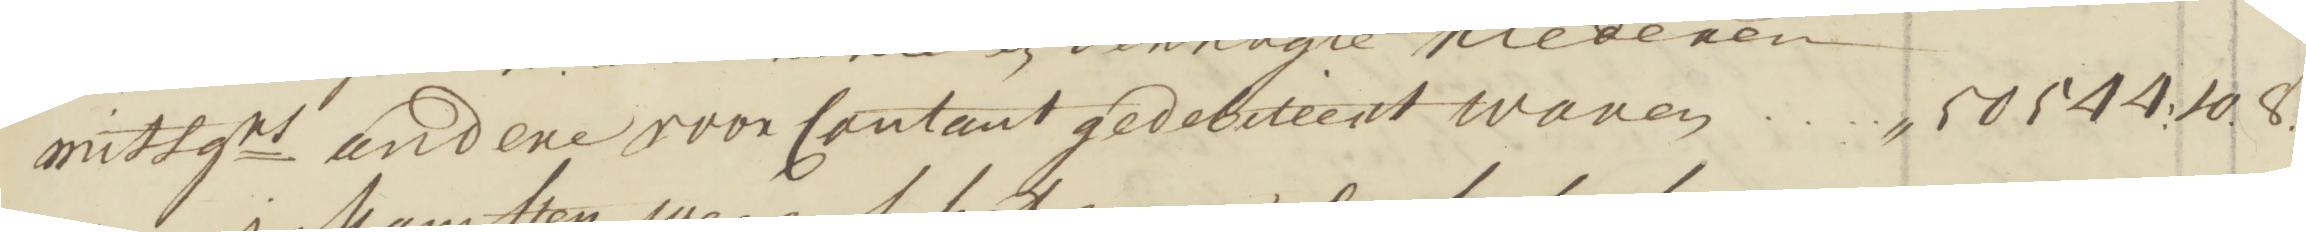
mitsg=rs andere voor Contant gedebiteert waren . . . . „ 50544: 10. 8
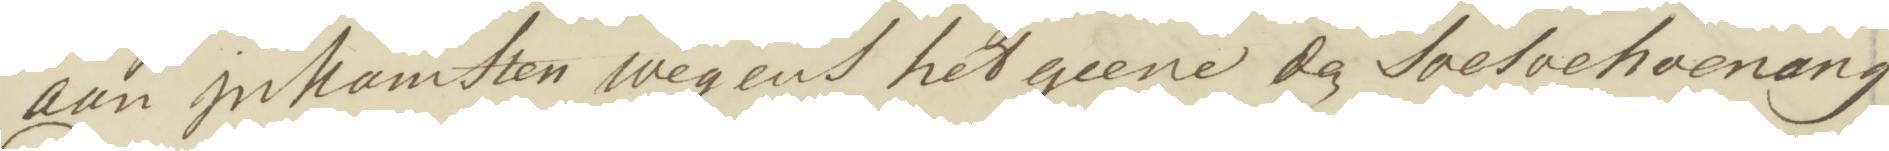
aan jnkomsten wegens het geene den soesoehoenang
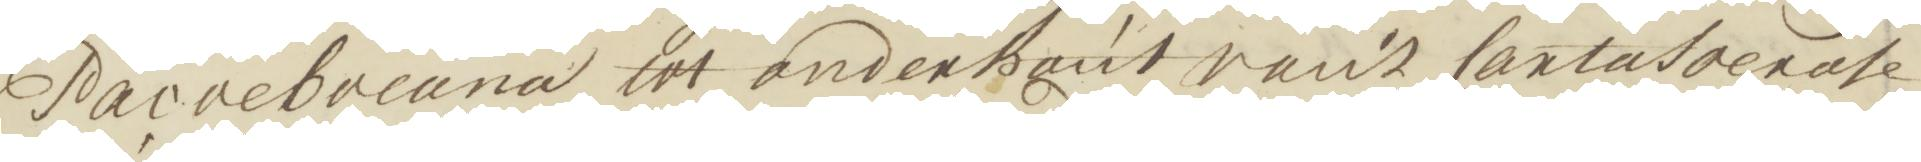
Pacoeboeana tot onderhout van't Cartasoerase
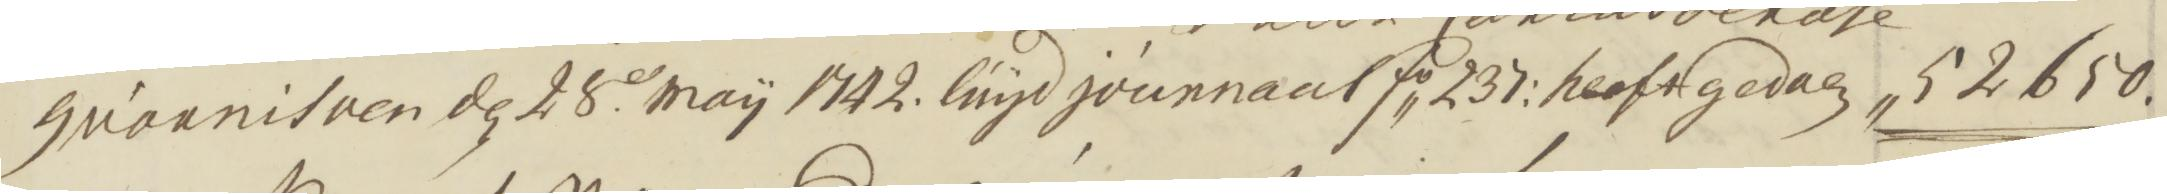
guarnisoen den 28.e maij 1742. luijd journaal f„o 237: heeft gedaen „ 52650.
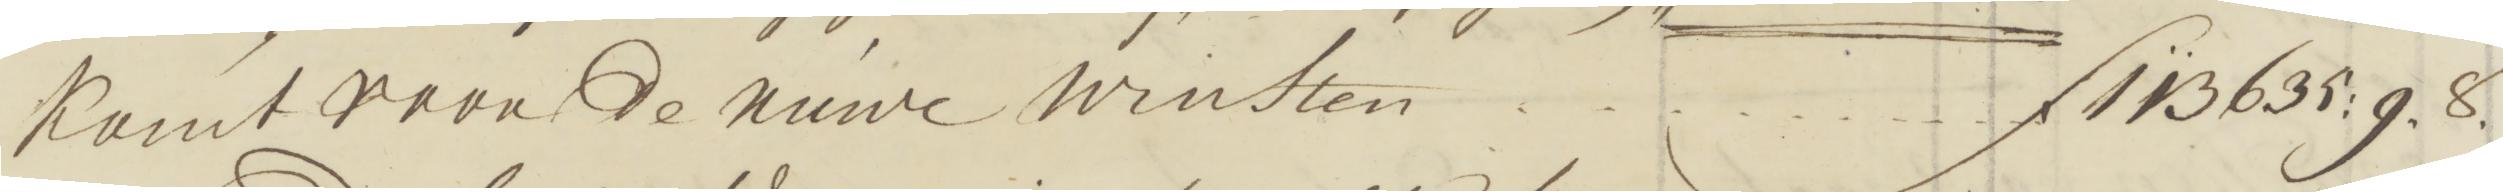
komt voor de ruwe winsten . . . . . . . . . . ƒ113635: 9. 8.
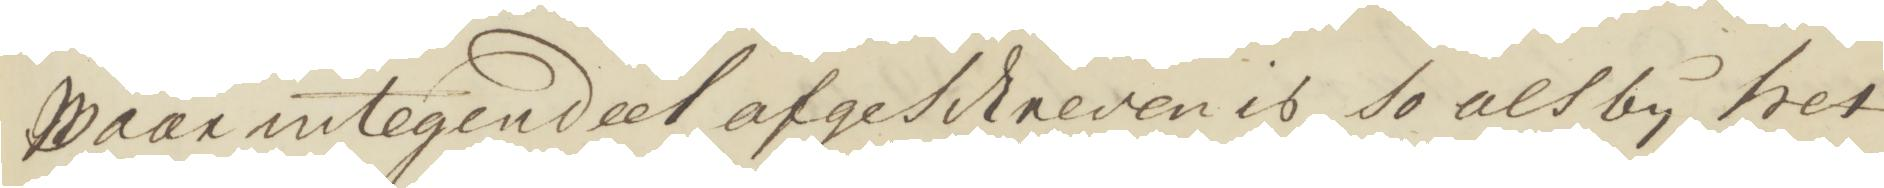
waar integendeel afgeschreven is so als bij het
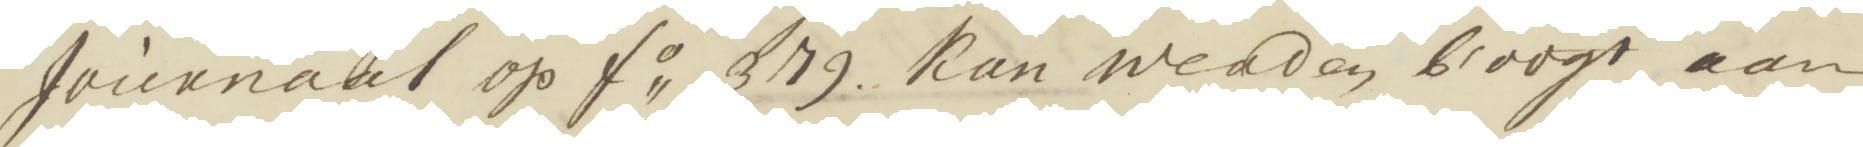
Journaal op f„o 379. kan werden b'oogt aan
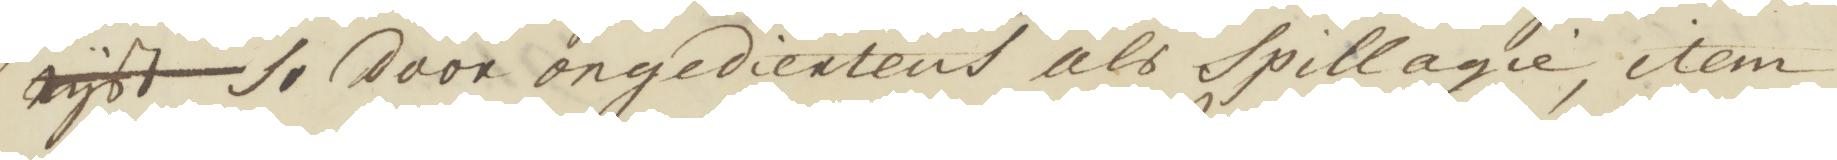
rijst so door ongediertens als spillagie, item
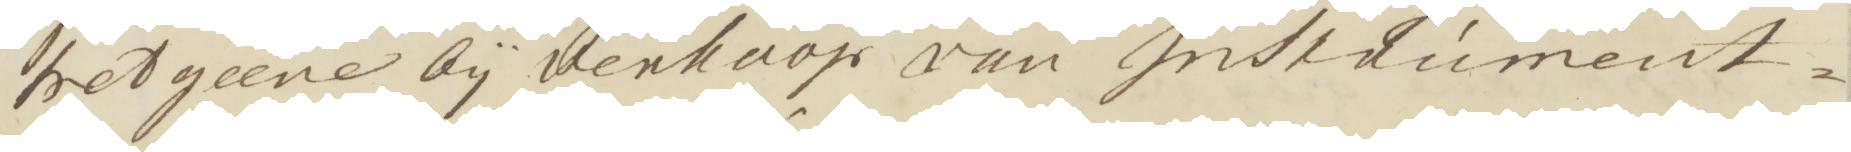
het geene bij verkoop van jnstrument=
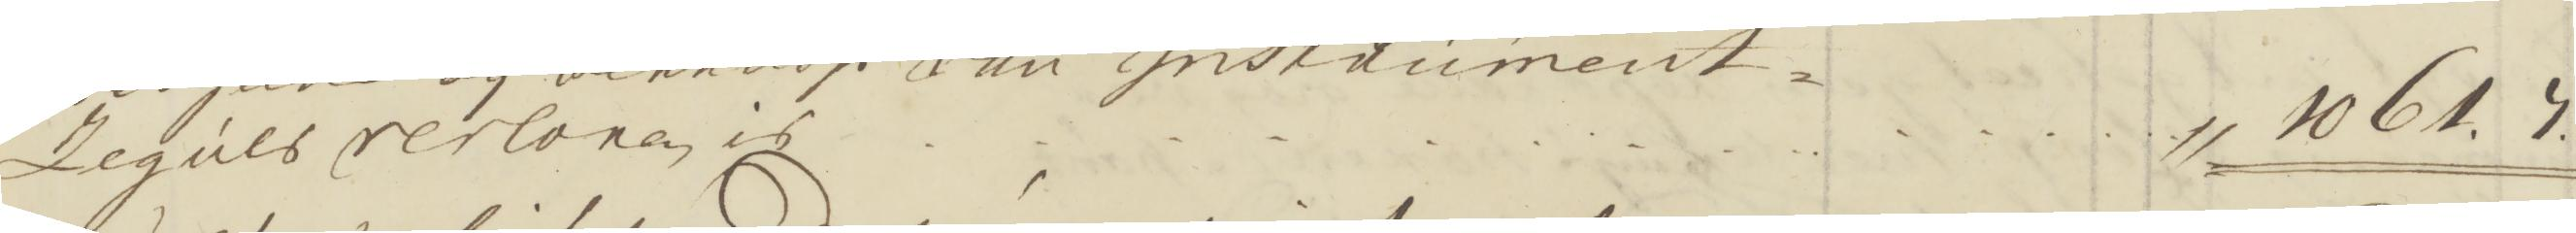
zeguls verloren is . . . . . . . . . . . . . . . . . „ 1061. 7.
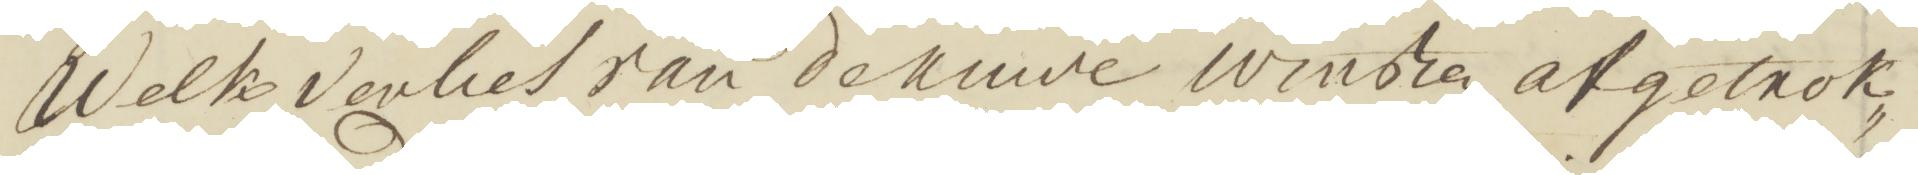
Welk verlies van de ruwe winsten afgetrok„
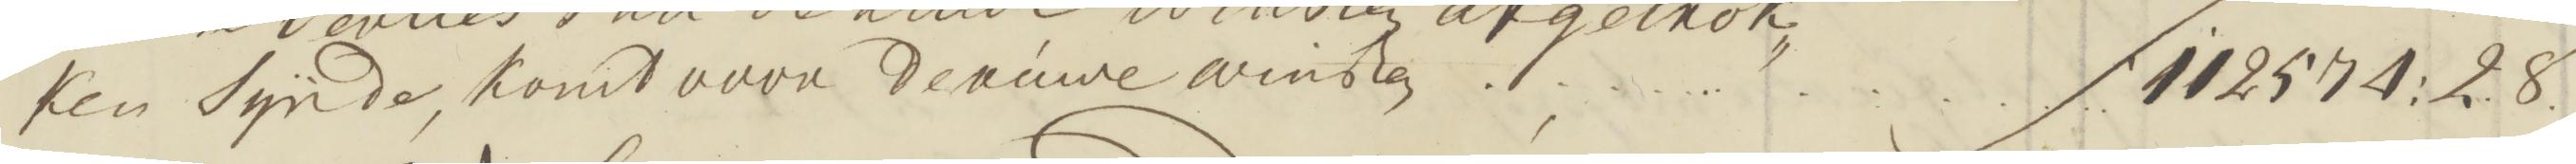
ken sijnde, komt voor de ruwe winsten . . . . . . . . . . . . . . ƒ112574: 2. 8.
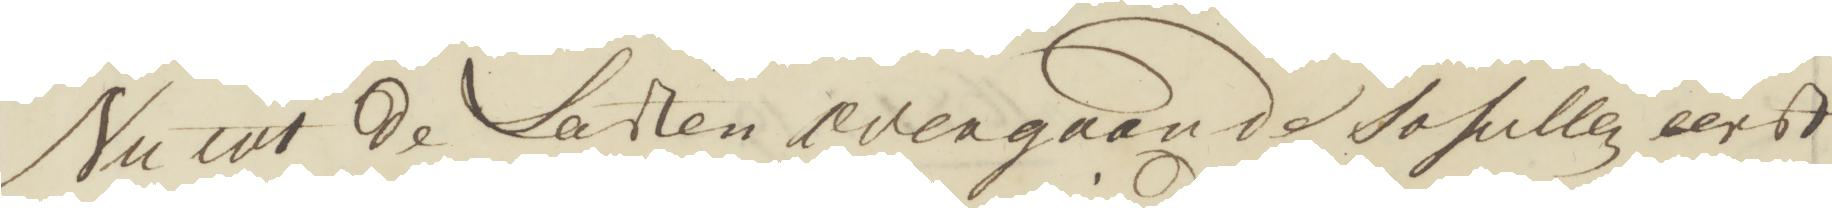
Nu tot de Lasten overgaande so sullen eerst
